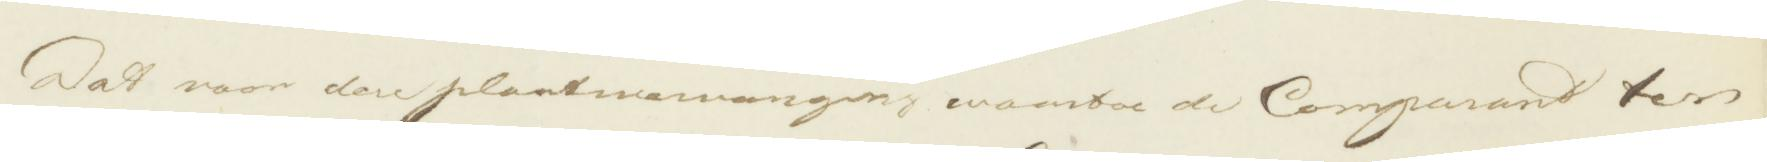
Dat voor den plaatsvervanging, waartoe de Comparant ten
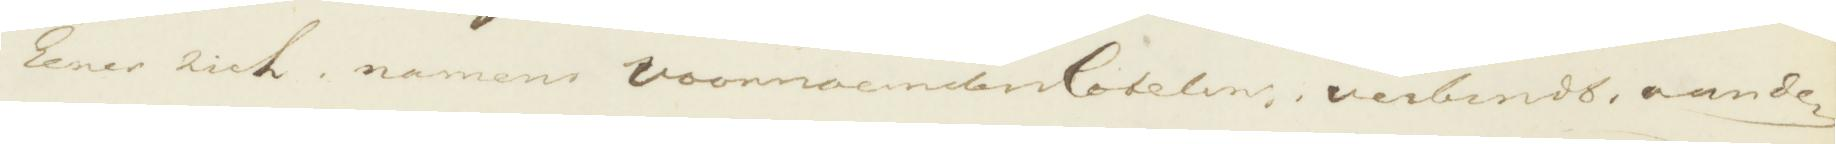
Eener zich, namens voornoemdenloteling, verbindt, aan den
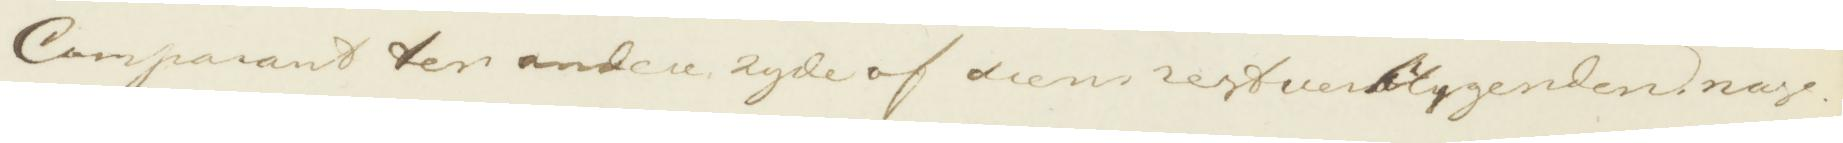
Comparant ter andere zyde of diens regtverkrygenden, nage
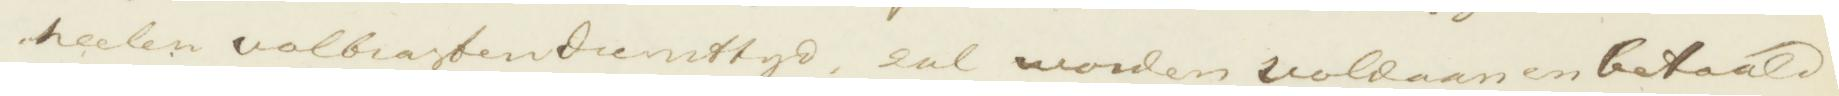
„heelen volbragten diensttyd, zal worden voldaan en betaald
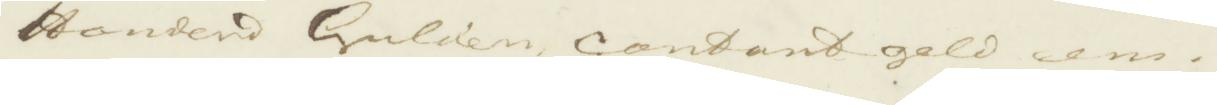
Honderd Gulden, contant geld eens.
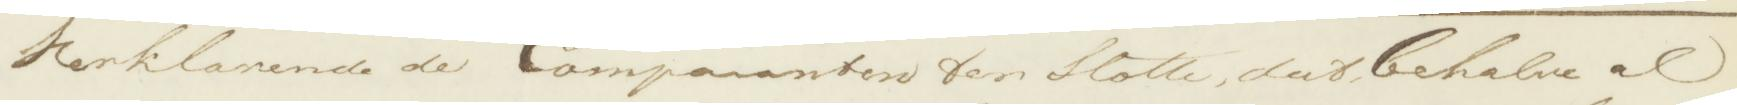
Verklarende de Comparanten ten slotte, dat behalve al
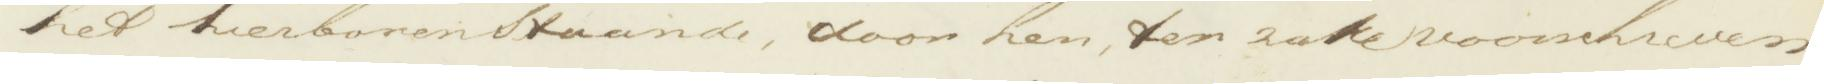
het hierbovenstaande, door hen, ter zake voorschreven
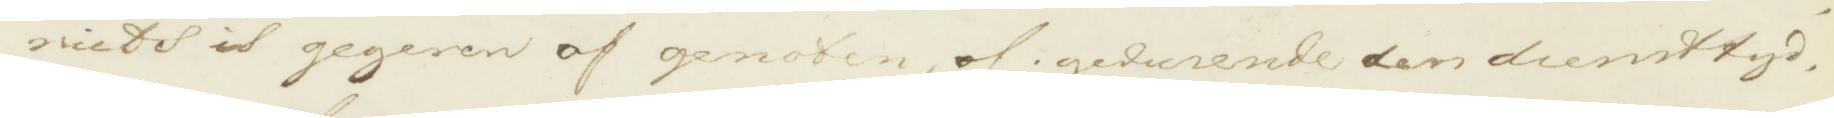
niets is gegeven of genoten, of .gedurende den diensttyd,
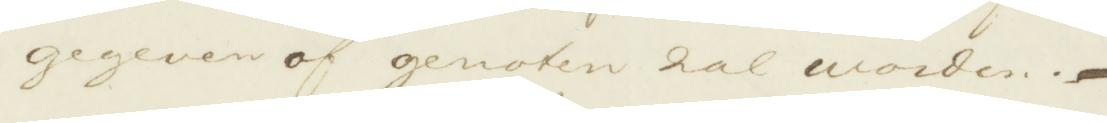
gegeven of genoten zal worden.-
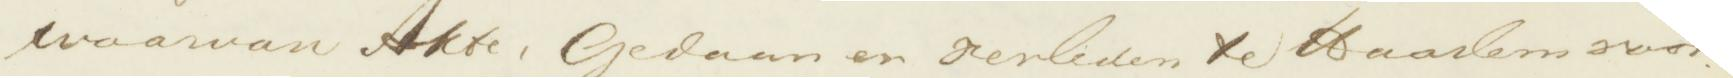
waarvan Akte, Gedaan en verleden te Haarlem voor
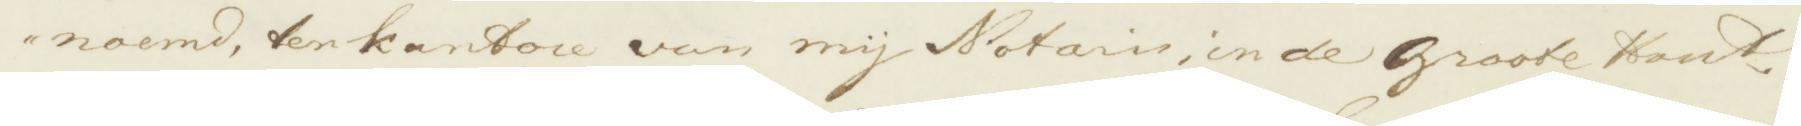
„noemd, ter kantore van mij Notaris, in de Groote Hout,
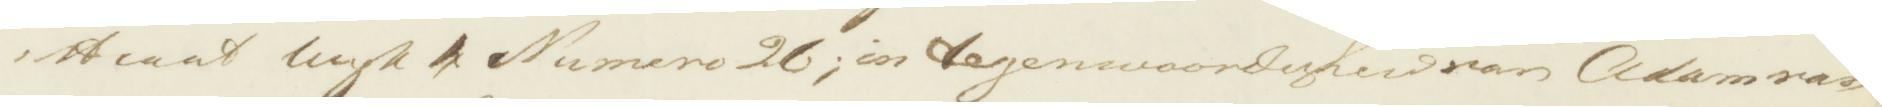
,straat wyk 4 Numero 26; in tegenwoordigheid van Adam van
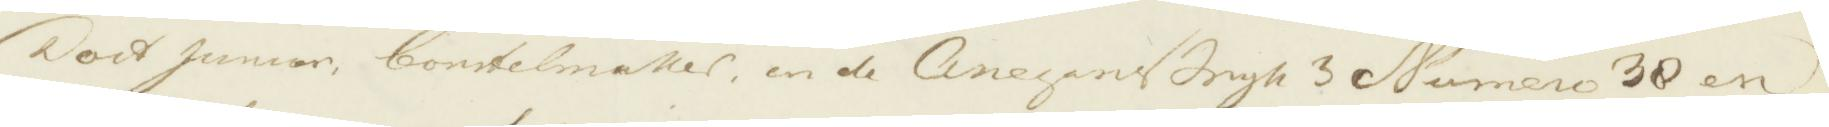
Dort Junior, borstelmaker, in de Anegang Wyk 3 Numero 38 en
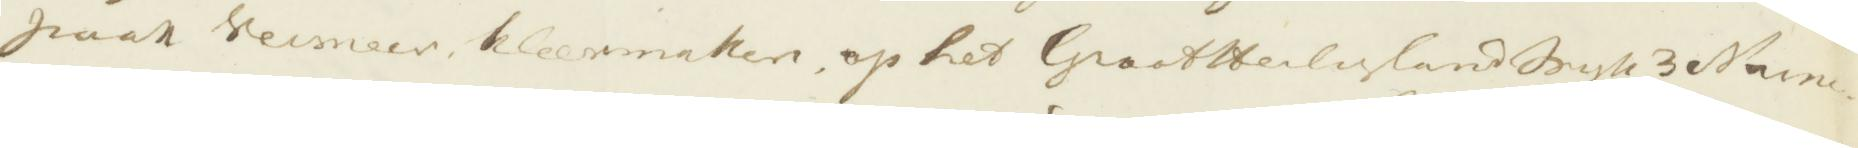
Jsaak Vermeer, kleermaker, op het GrootHeiligland Wyk 3 Nume
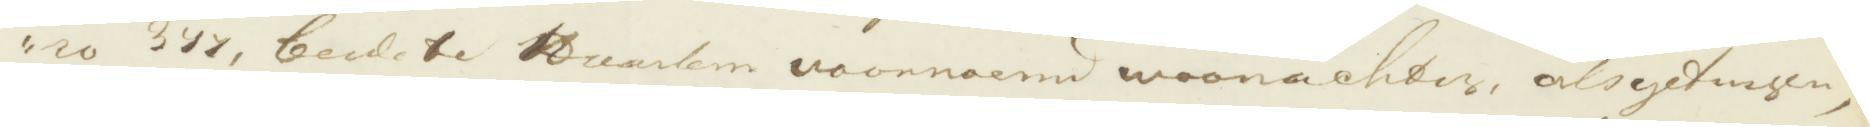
„ro 377, beide te Haarlem voornoemd woonachtig, als getuigen;
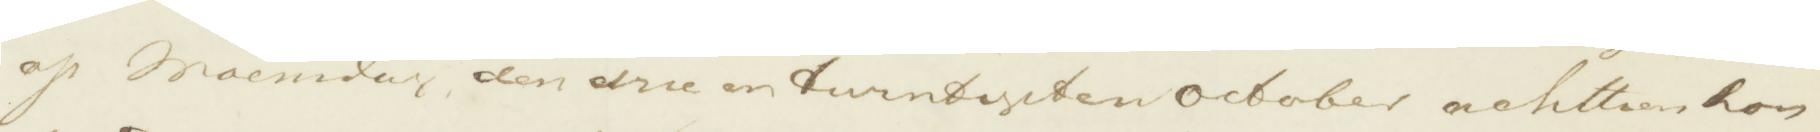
op Woensdag den drie en twintigsten October achttien hon
